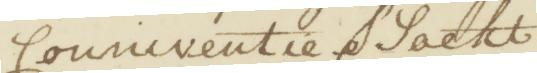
Conniventie versoekt
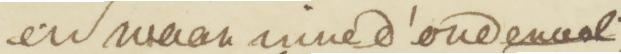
en waar inne d' ondervol
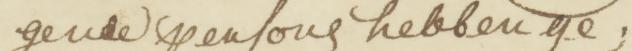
gende personen hebben ge;
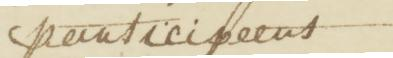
participeert
